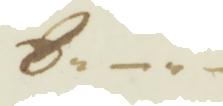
8„ — „ -
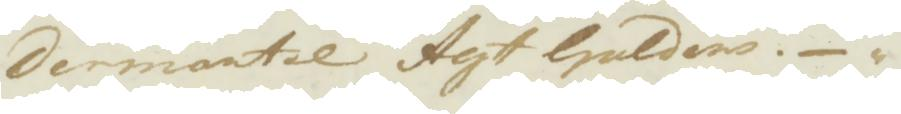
dermantel, Agt Guldens. — „
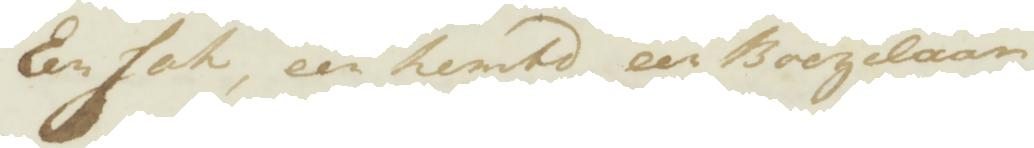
Een Jak, een hemtd, een Boezelaar,
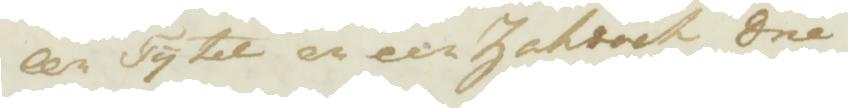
een Fijtel en een Zakdoek, drie
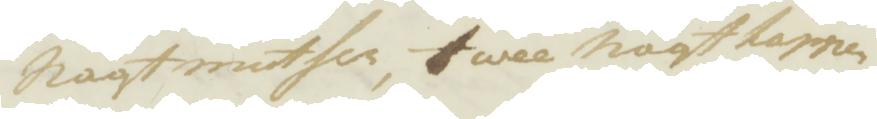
Nagtmutsen, twee nagtkappen,
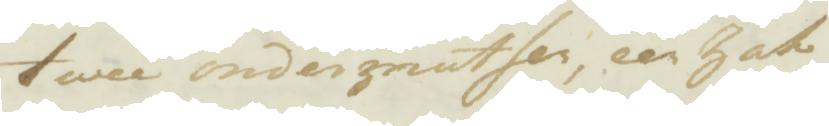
twee ondermutsen, een Zak
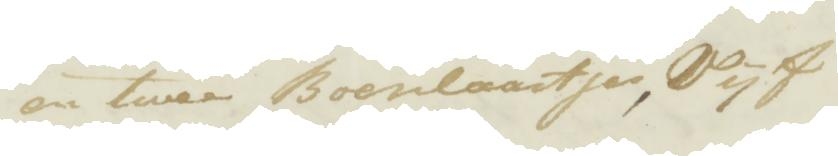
en twee Boezelaartjes, Vijf
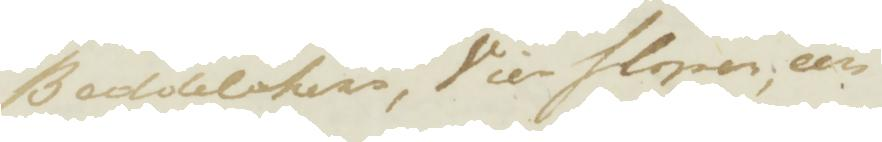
Beddelakens, Vier slopen, een
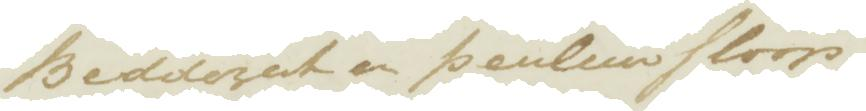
Beddezak en peuluwsloop,
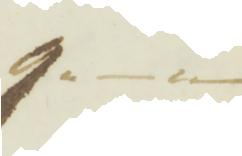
9„ —
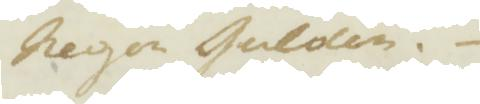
negen gulden. -
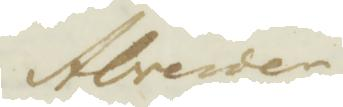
Alverder
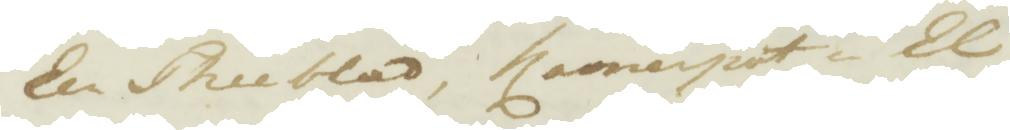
Een Theeblad, Kamerpot en El
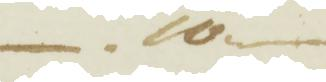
— „ 10„—
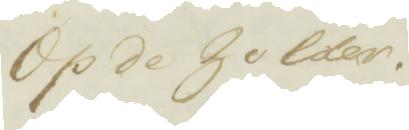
Op de zolder.
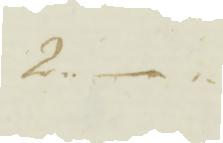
2„ — „
